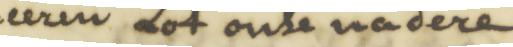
eeren tot onze nadere
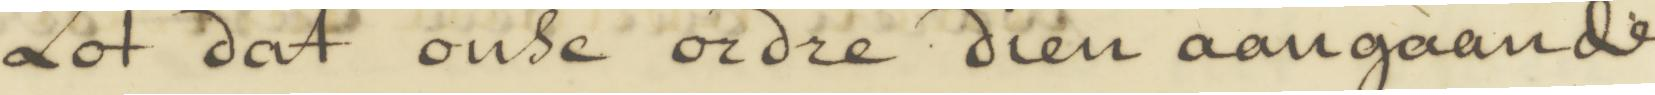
tot dat onse ordre dien aangaande
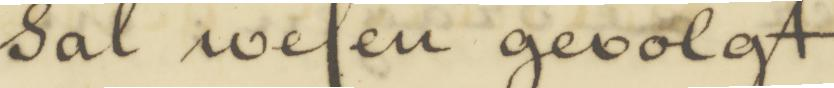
sal wesen gevolgt
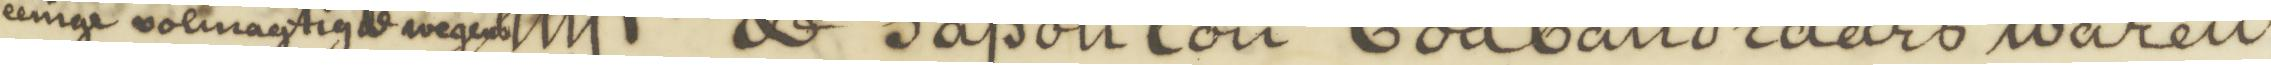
eenige volmagtigde wegens Uijt de sapoulou boabandhaars waren
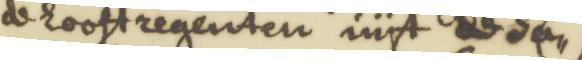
de hooftregenten uijt de sa„
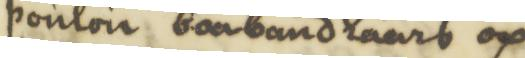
poulou boabandhaars op
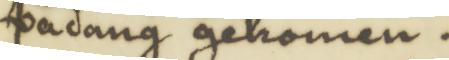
Padang gekomen .
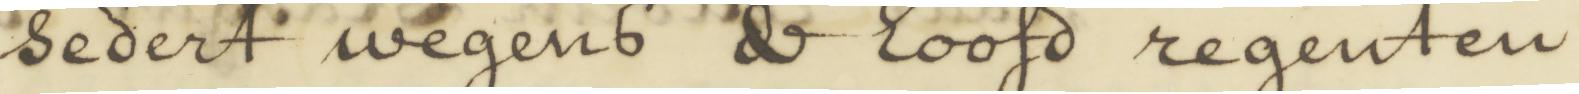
sedert wegens de hoofd regenten
